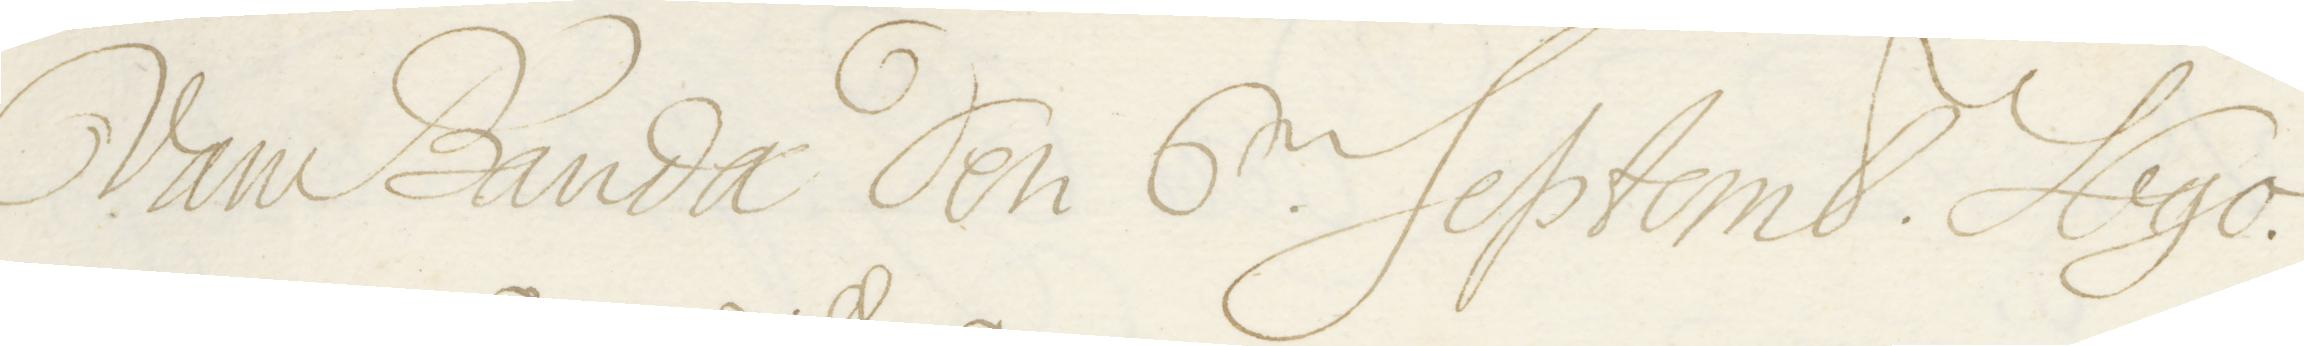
Van Banda den 6.n Septemb. 1690.
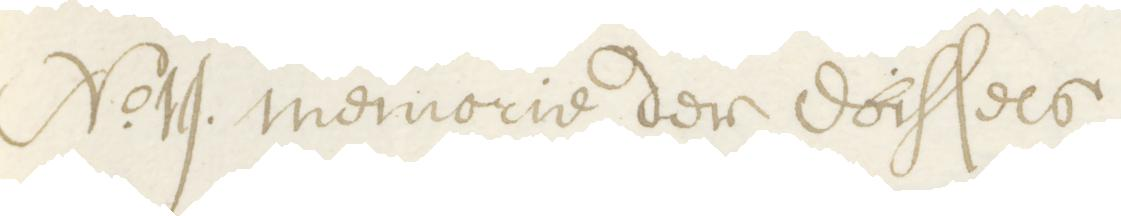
N:o 14. memorie der wissels
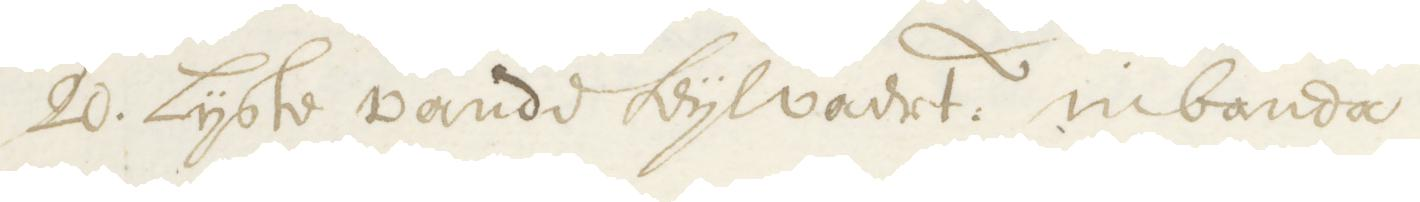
20. lijste vande seijlvaert: in banda
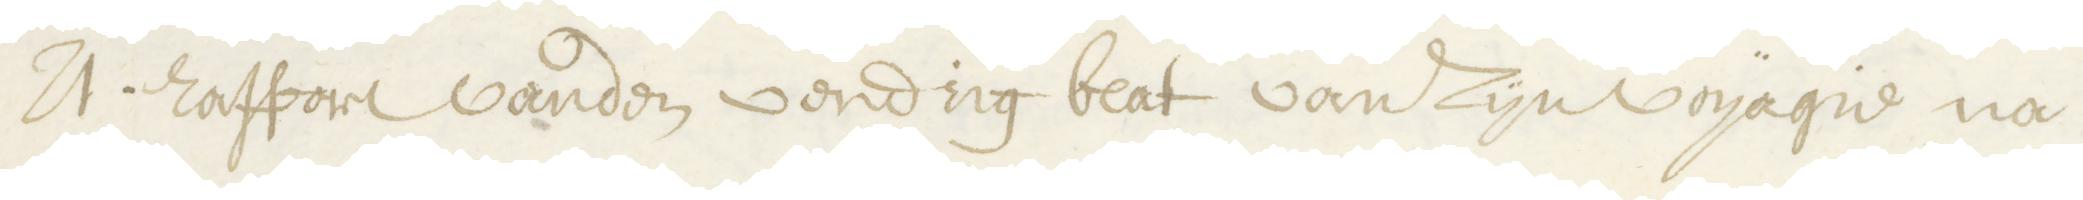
21. rapport vanden vendrig blat van zijn voijagie na
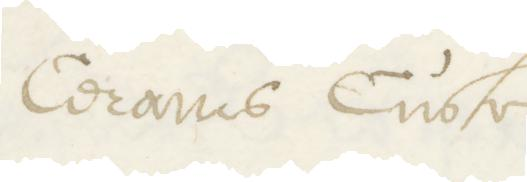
Cerams Custe
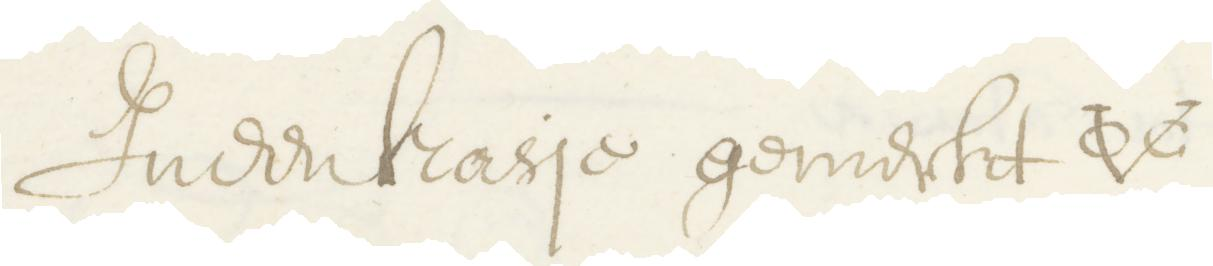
In een kasje gemerkt
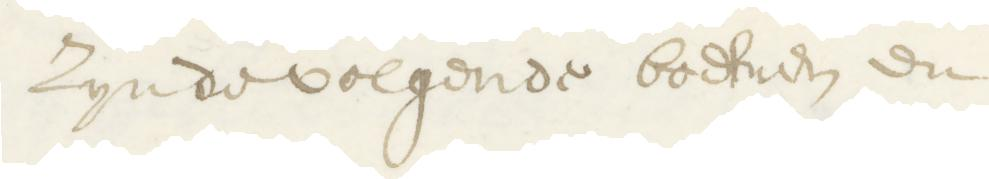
zijn de volgende boeken en
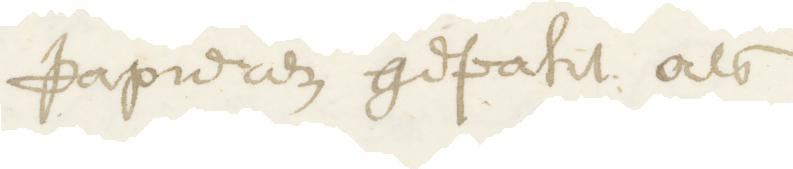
papieren gepakt als
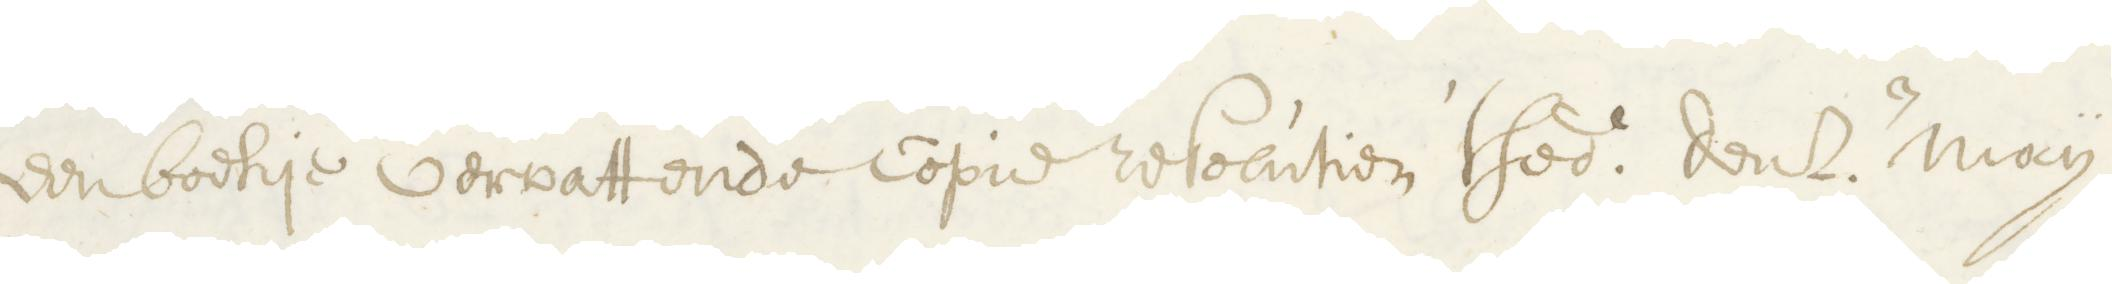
een boekje vervattende Copie resolutien 'tsed.t den 2.en maij
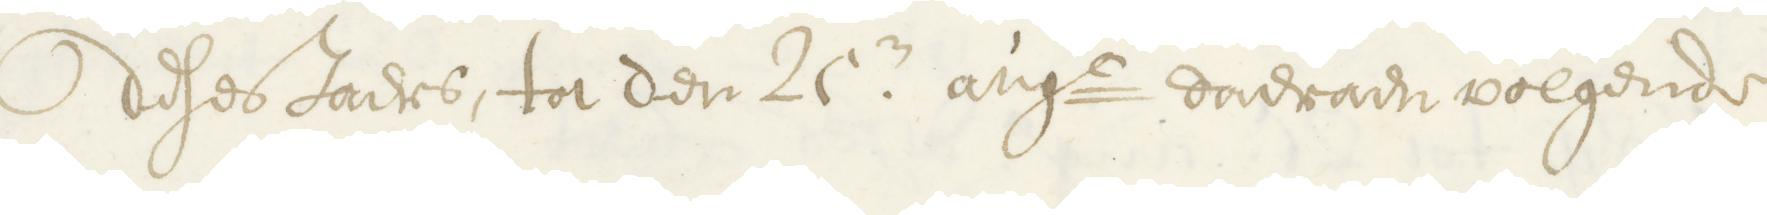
deses Iaers, tot den 25.en aug=o daeraen volgende
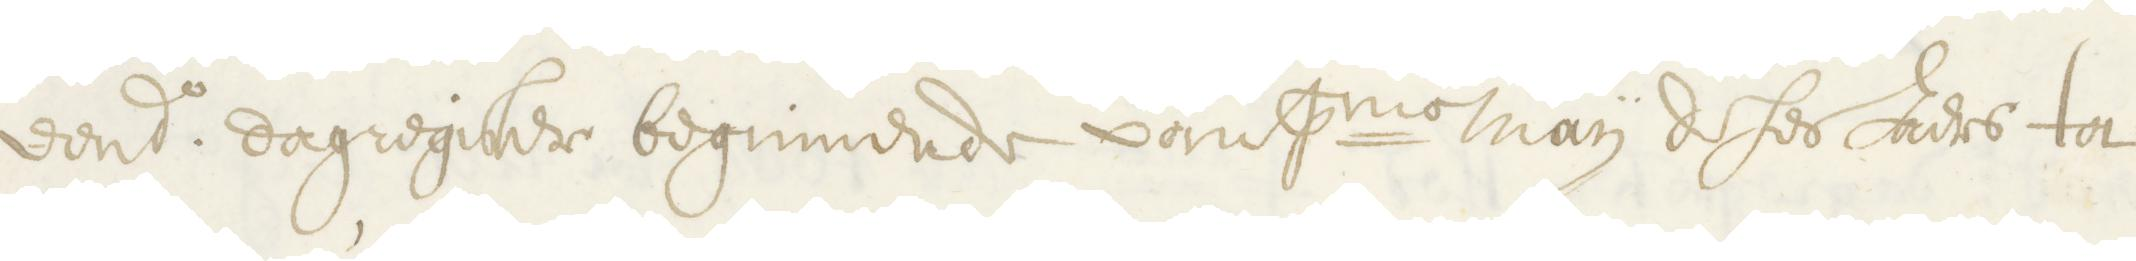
een d.o dagregiser beginnende van p=mo maij deses Iaers tot
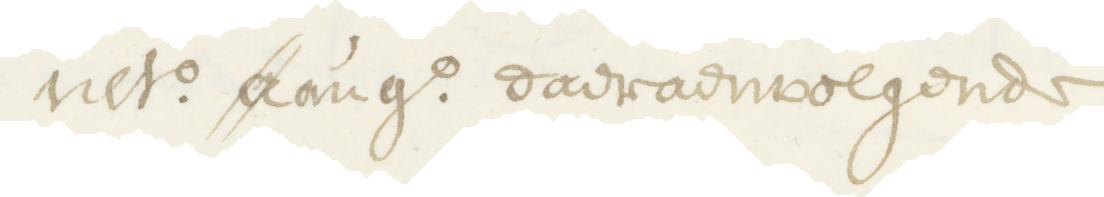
ult.o aaug.o daeraenvolgende
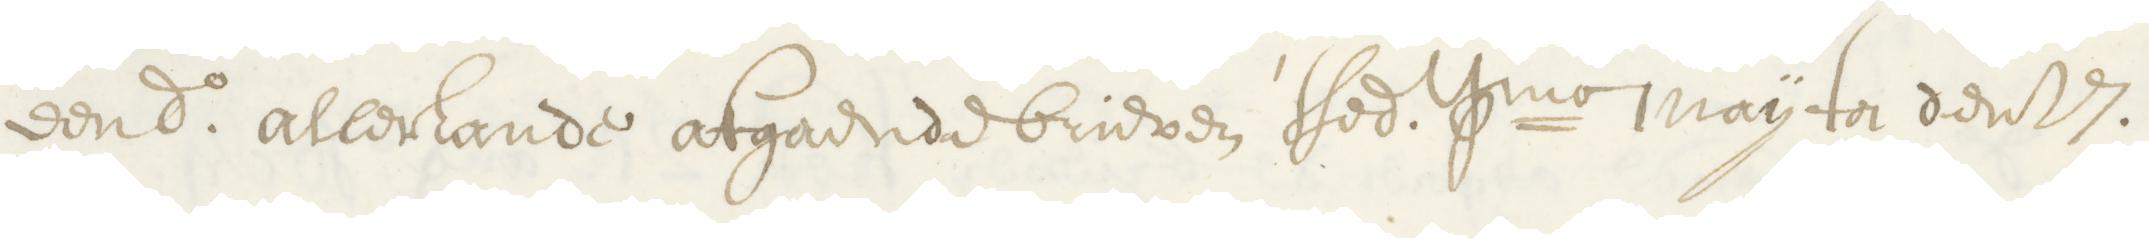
een d.o allerhande afgaende brieven 'tsed.t p=mo maij tot den 27.
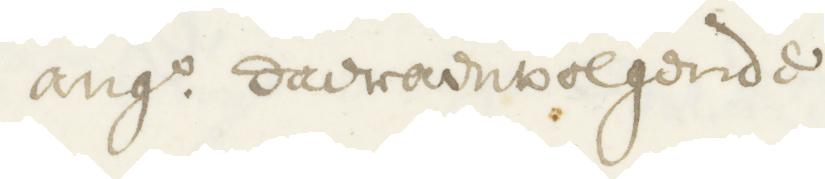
aug.o daeraenvolgende
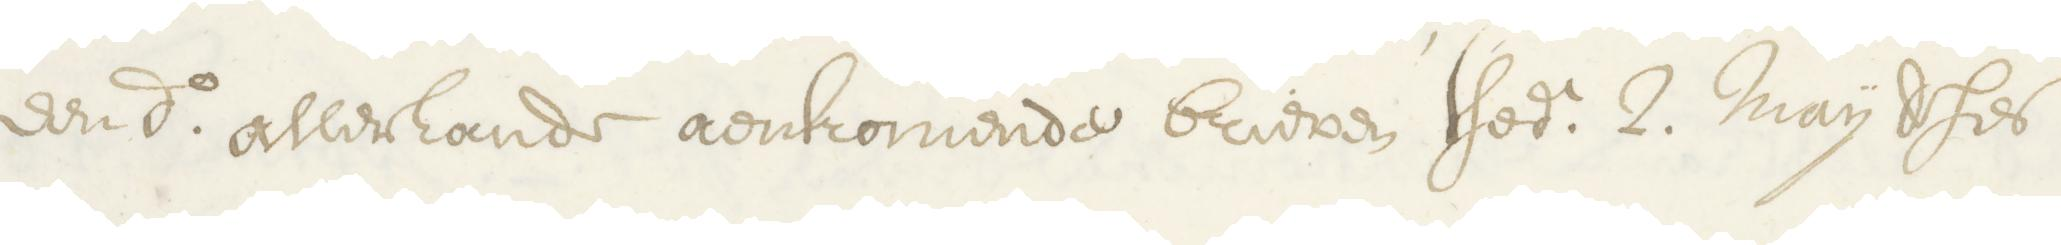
een d.o allerhande aenkomende brieven 'tsed.t 2. maij deses
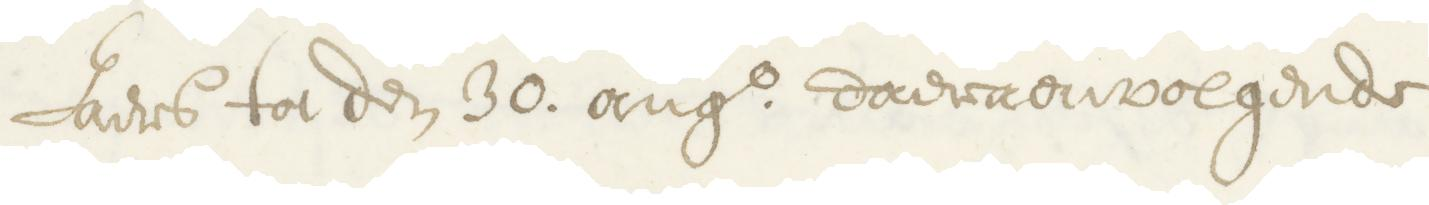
Iaers tot den 30. aug.o daeraenvolgende
